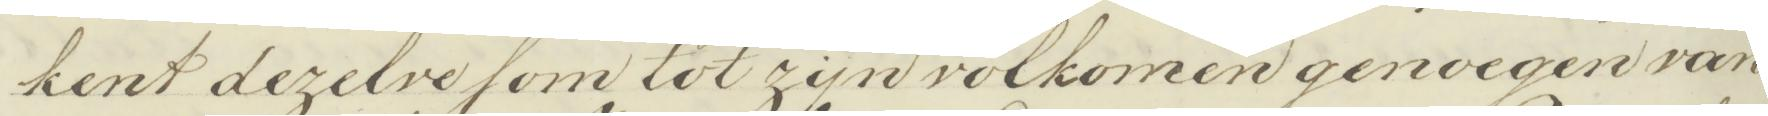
kent dezelve som tot zijn volkomen genoegen van
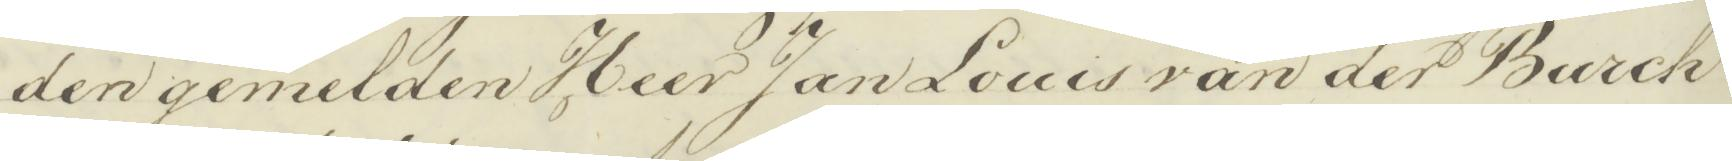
den gemelden Heer Jan Louis van der Burch
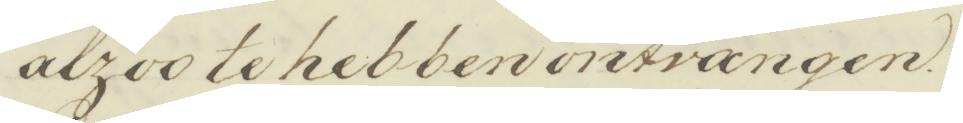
alzoo te hebben ontvangen.
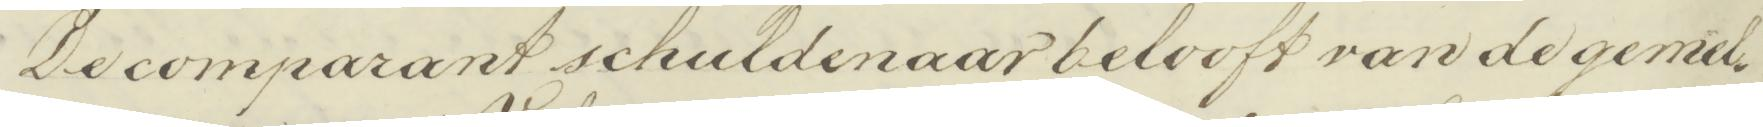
De comparant schuldenaar belooft van de gemel„
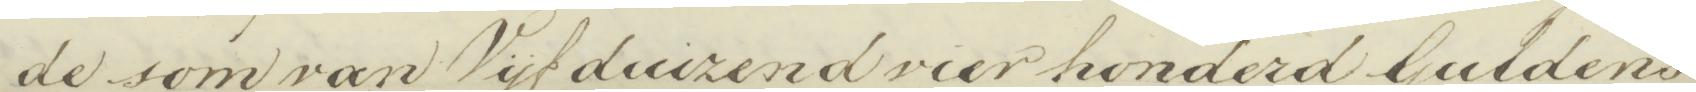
de som van Vijf duizend vier honderd Guldens
